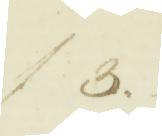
ƒ 3.
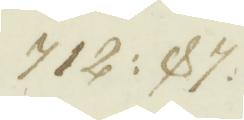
712:87:
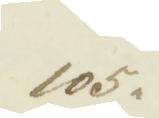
105„
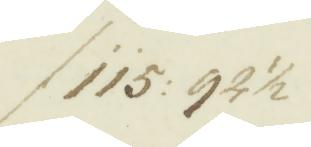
ƒ115:92½
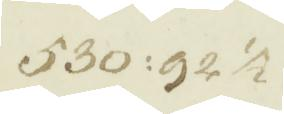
530:92½
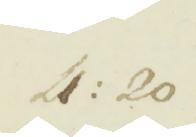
4: 20
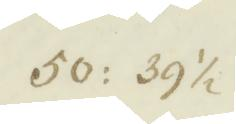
50: 39½
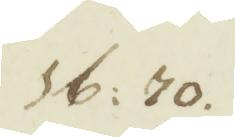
16: 70.
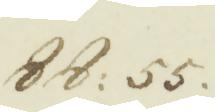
86: 55.
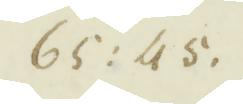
65: 45.
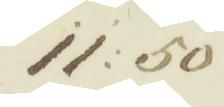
11: 50
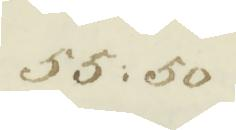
55: 50
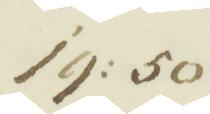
19: 50
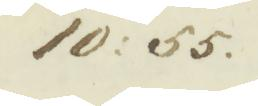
10: 55.
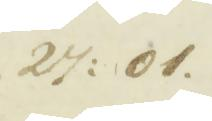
27: 01.
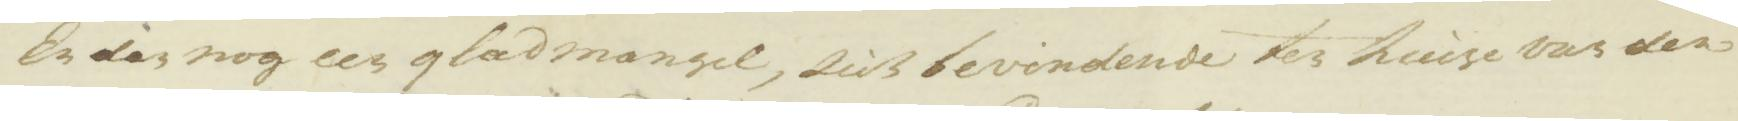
En den nog een gladmangel, zich bevindende ten huize van den
